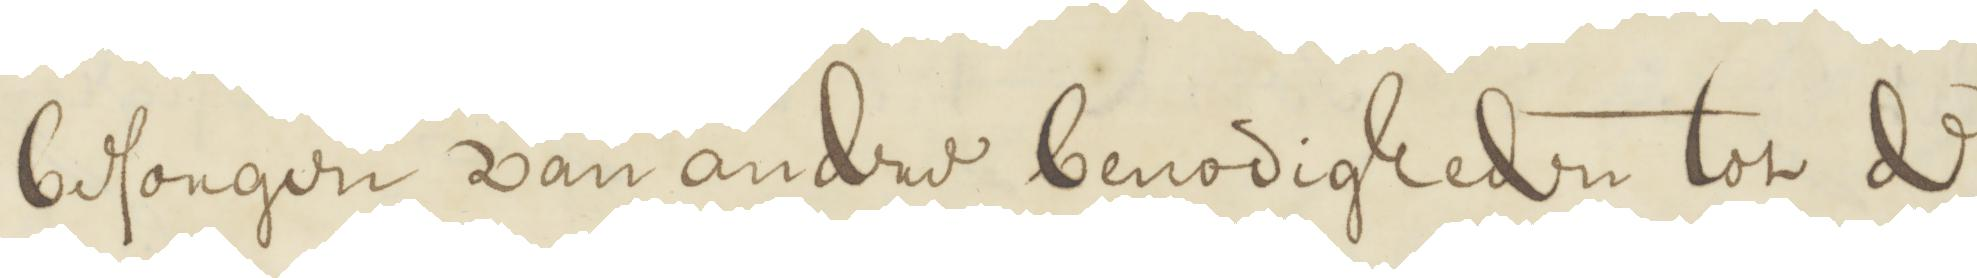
besorgen van andere benodigheden tot de
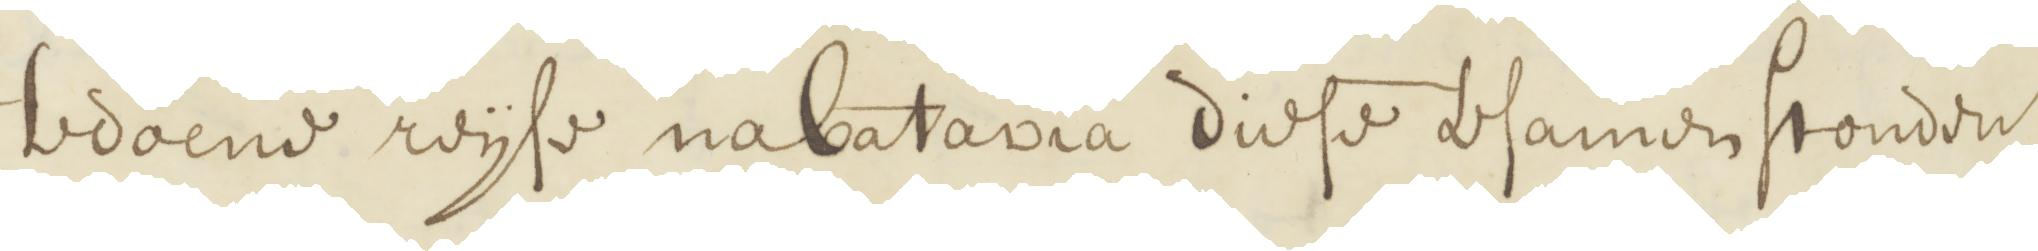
tedoene reijse na batavia diese tesamen stonden
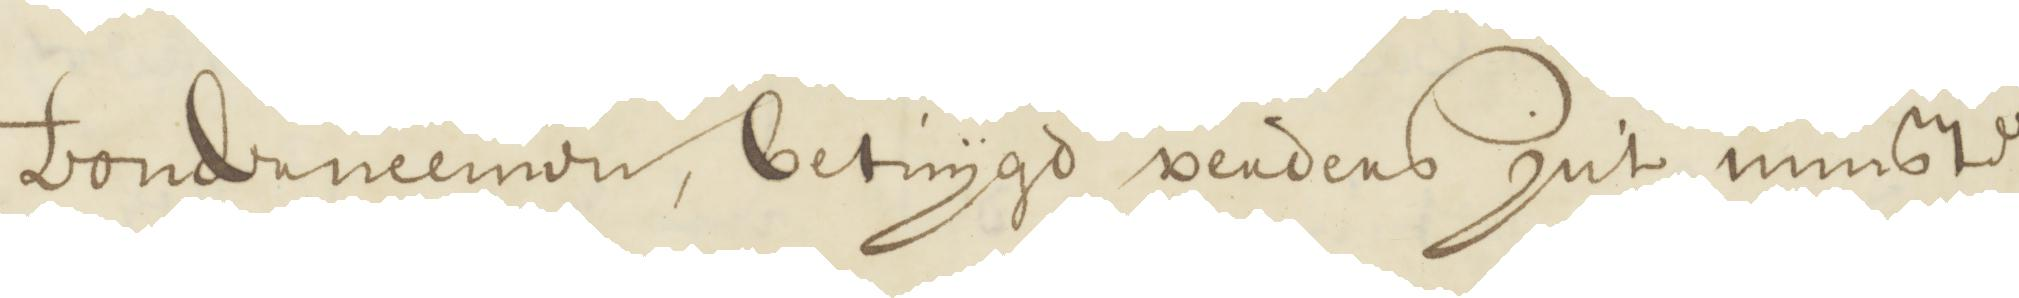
teonderneemen, betuijgd verders jn't minste
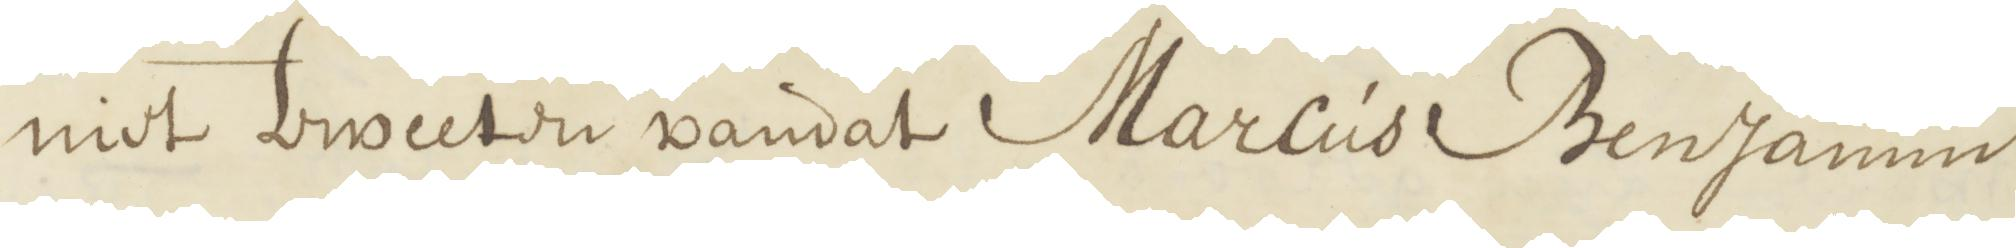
niet teweeten vandat Marcus Benjamin
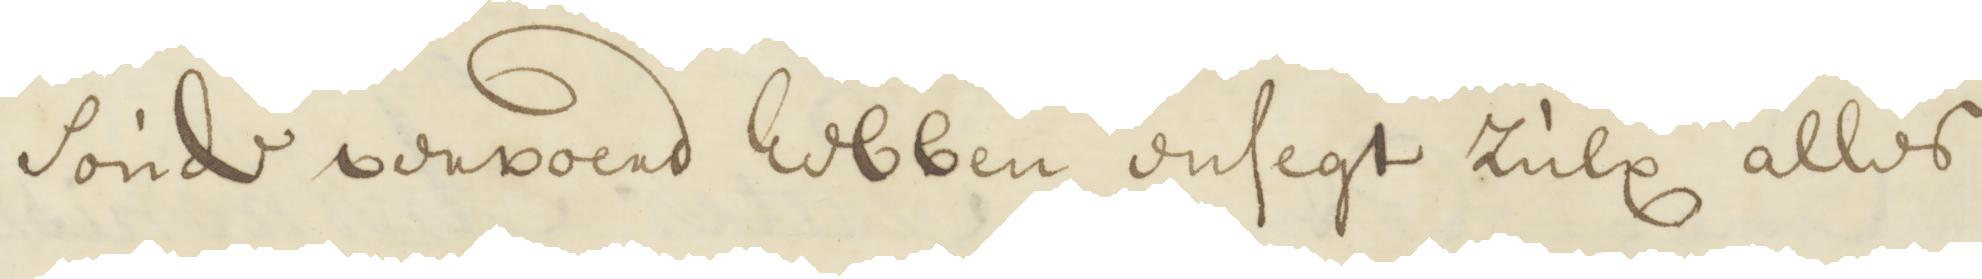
soude vervoerd hebben en segt zulx alles
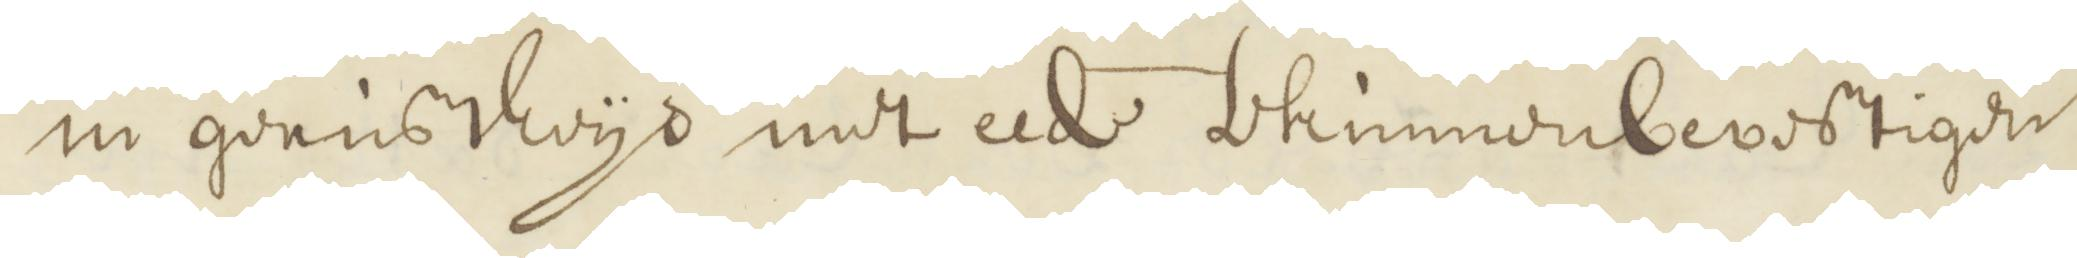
in gerustheijd met eede tekunnen bevestigen
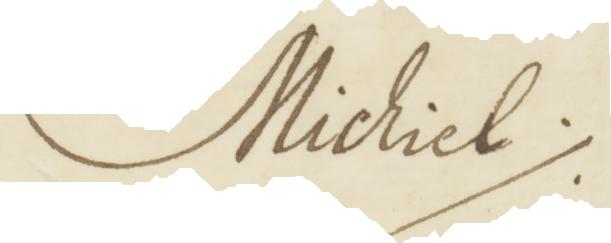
Michiel./.
